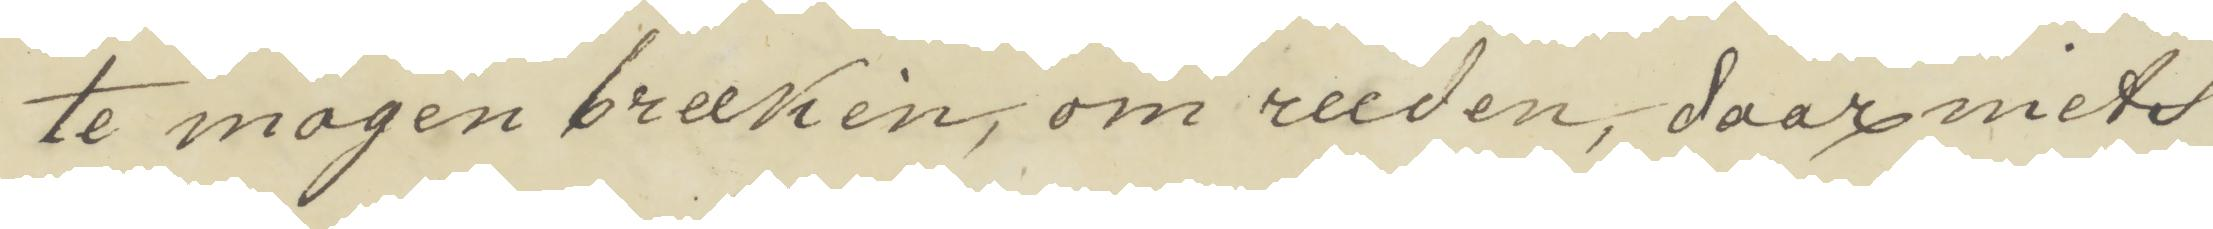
te mogen breeken, om reeden, daar niets
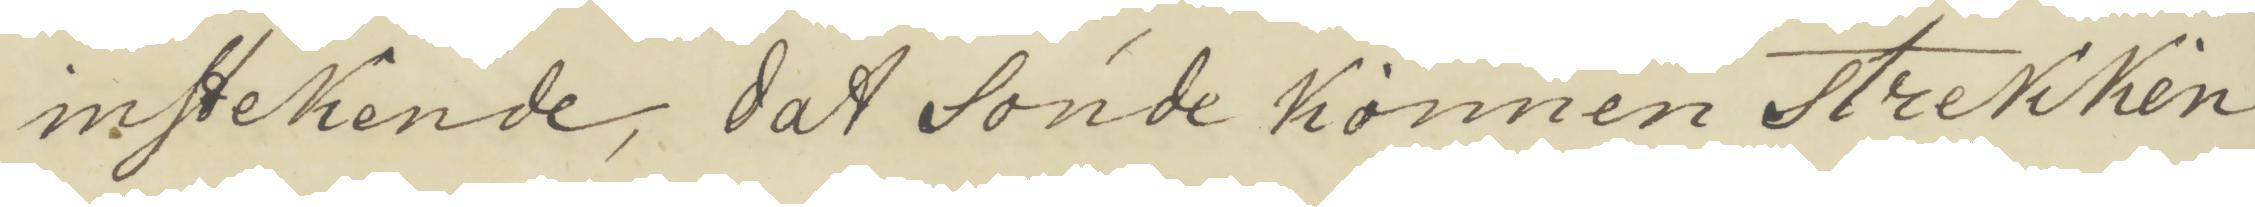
instekende, dat soude konnen strekken
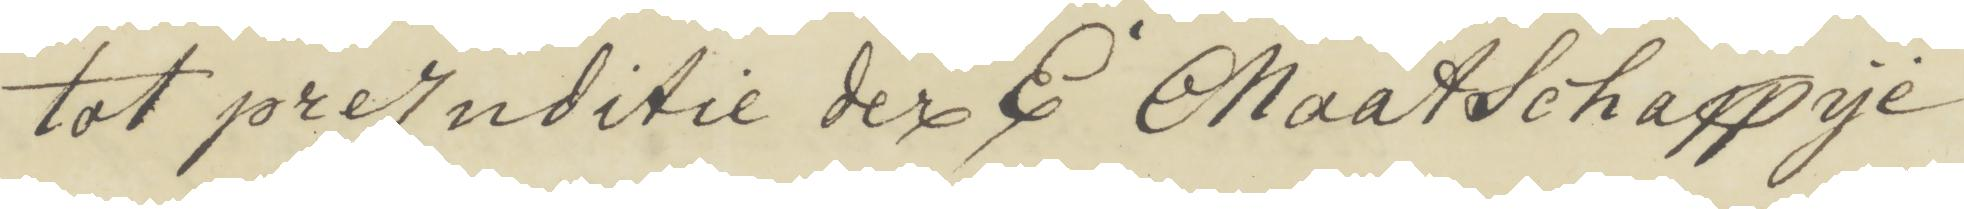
tot prejuditie der E' Maatschappije
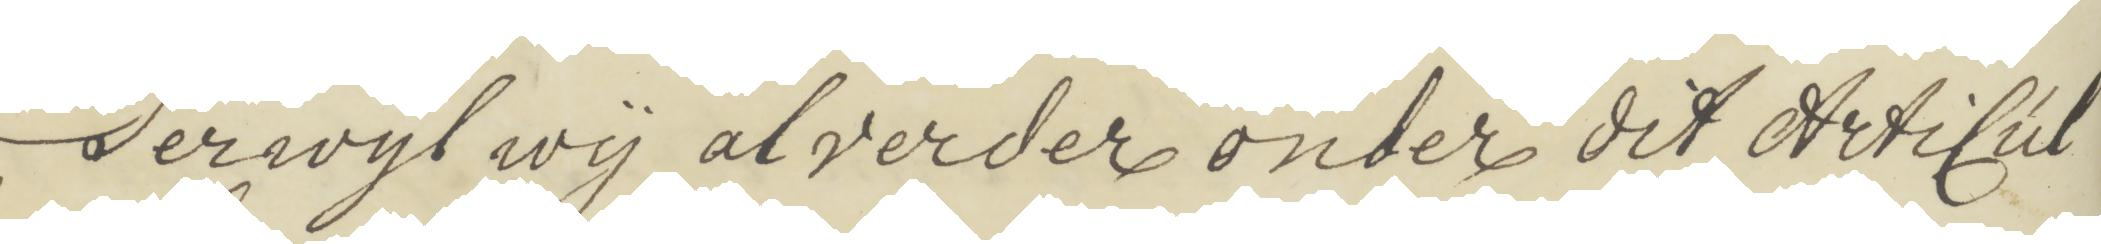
Terwijl wij al verder onder dit Articul
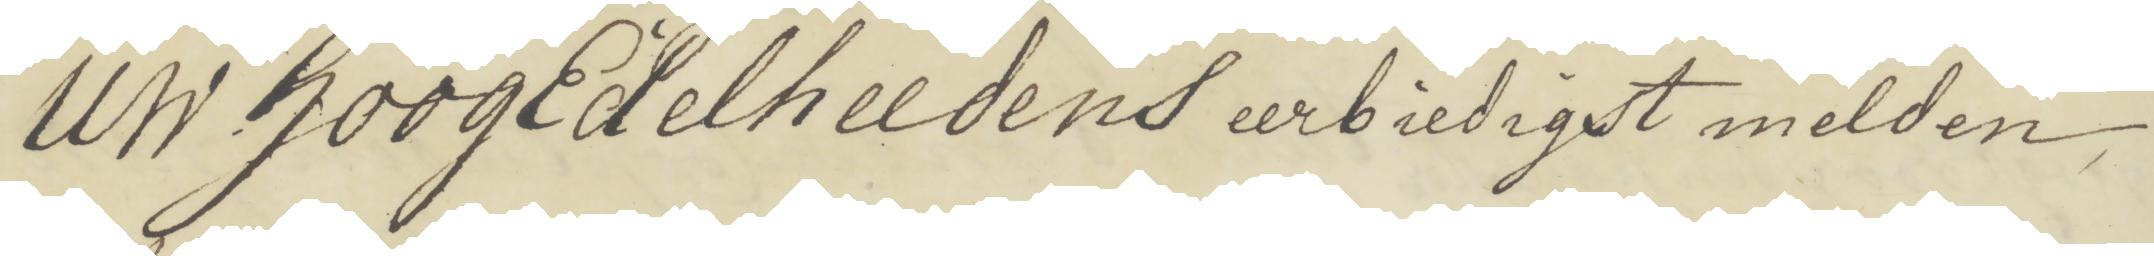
uw Hoog Edelheedens eerbiedigst melden,
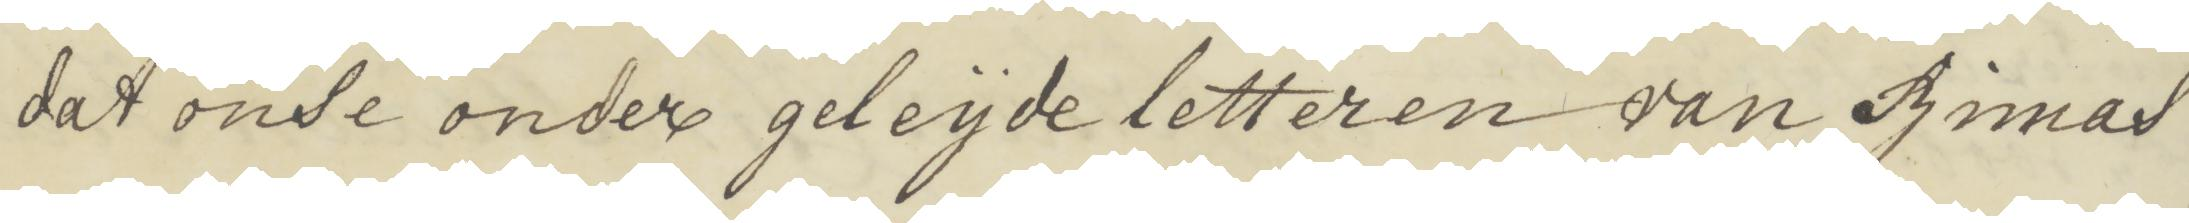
dat onse onder geleijde letteren van Bimas
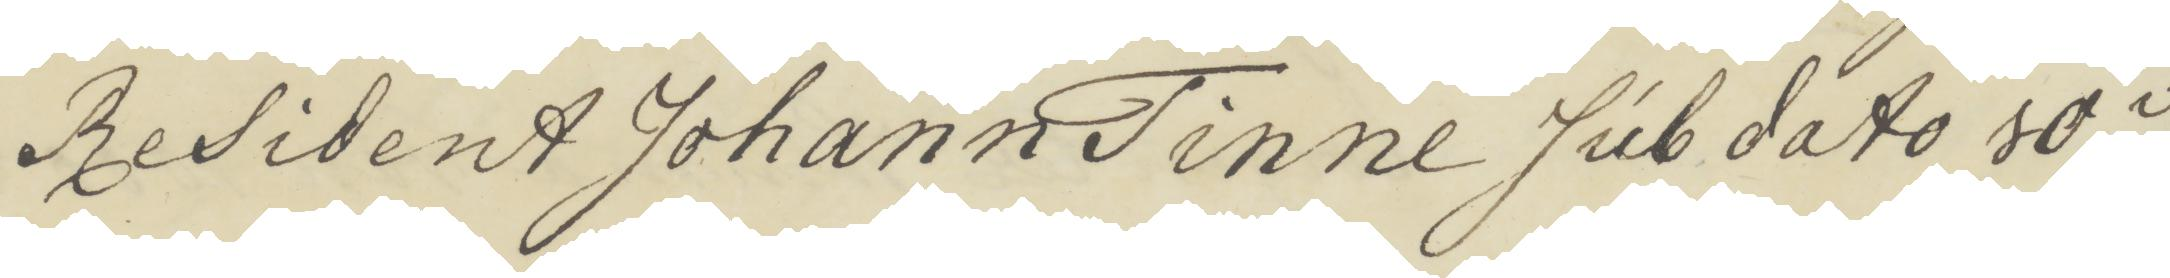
Resident Johann Tinne sub dato 10„e
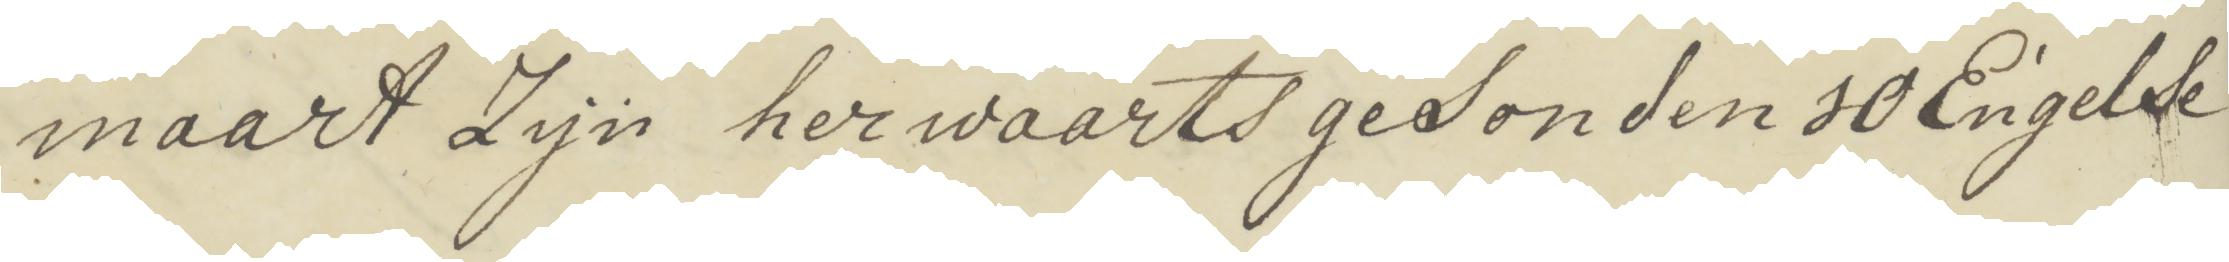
maart zijn herwaarts gesonden 10 Engelse
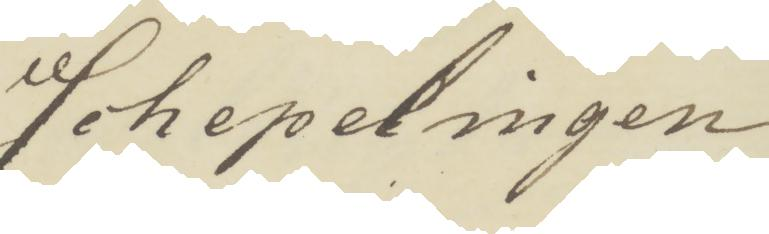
schepelingen
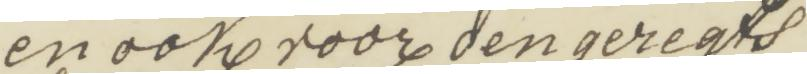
en ook voor den geregts
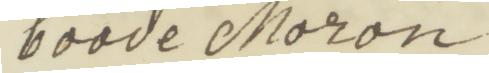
boode Moron
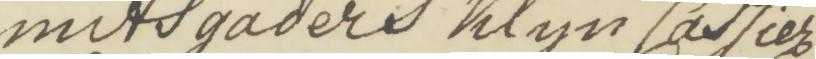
mitsgaders klijn Cassier
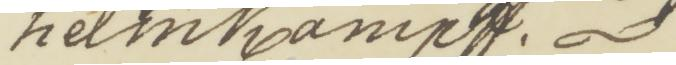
helmkampff.~
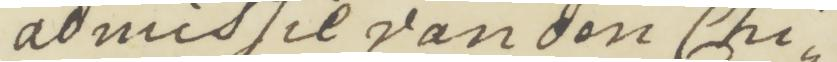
admissie van den Chi„
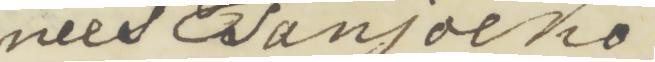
nees Tanjoeko
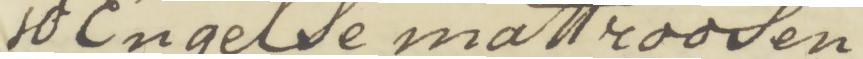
10 Engelse mattroosen
